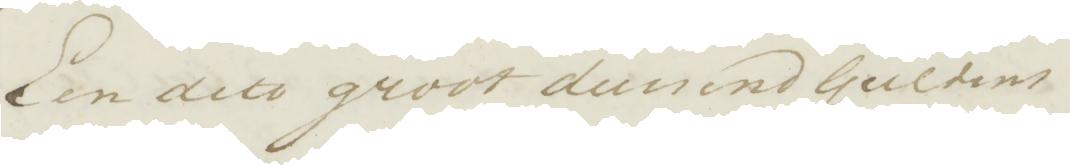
Een dito groot duisend Guldens
